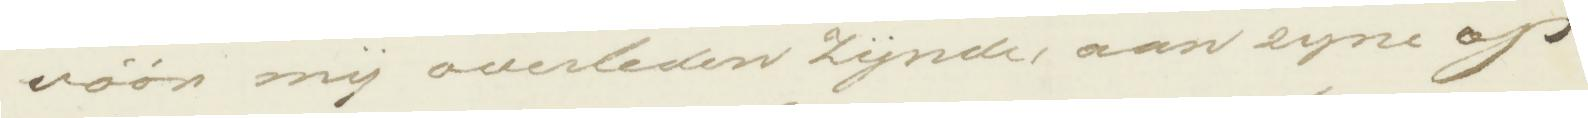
vóór mij overleden zijnde, aan zyne op
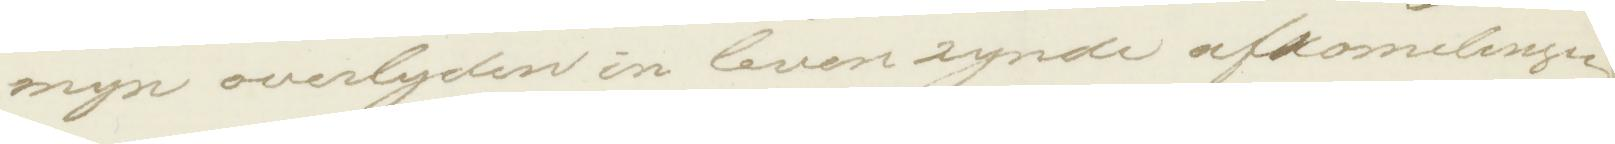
myn overlyden in leven zynde afkomelingen
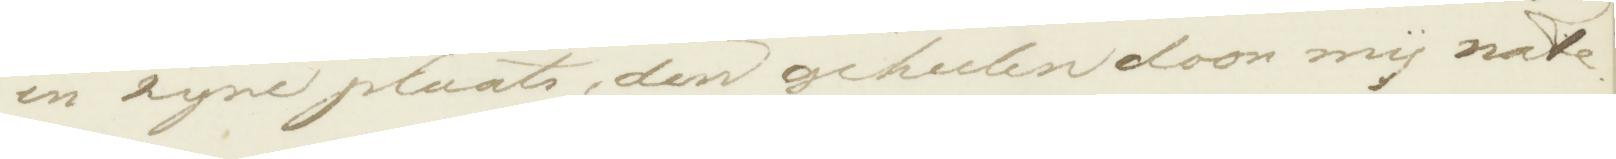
in zyne plaats, den geheelen door mij nate
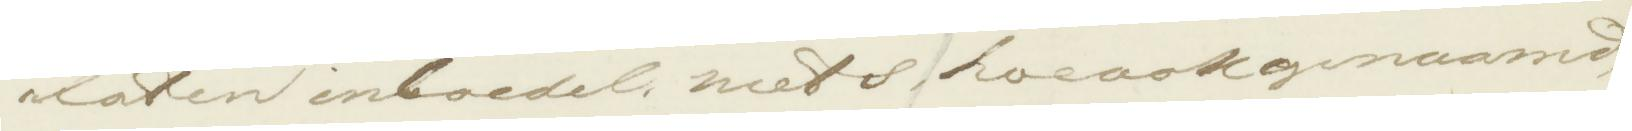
„laten inboedel, niets, hoe ook genaamd,
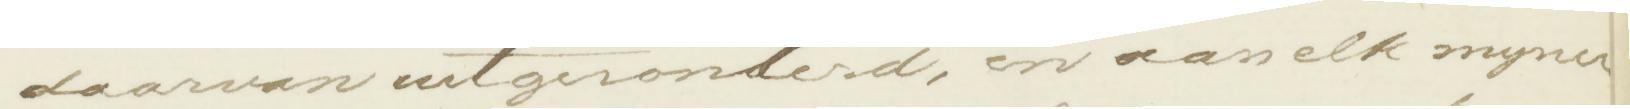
daarvan uitgezonderd, en aan elk myner
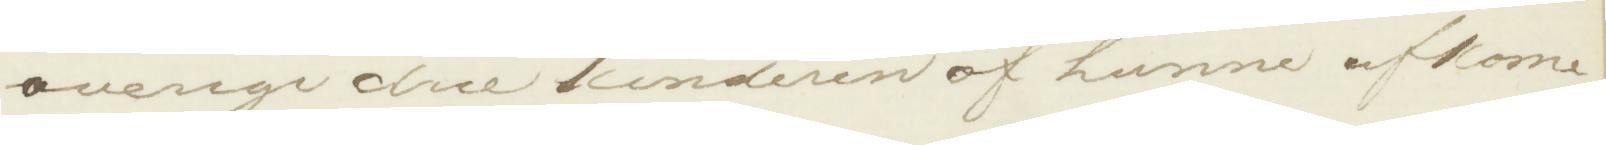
overige drie kinderen of hunne afkome
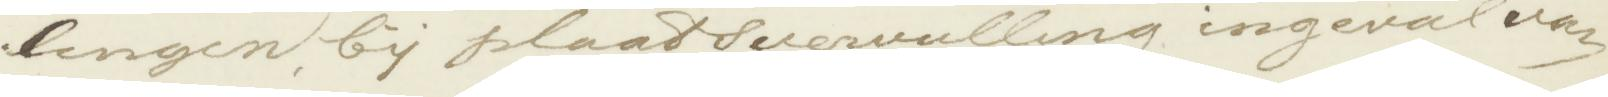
lingen, bij plaatsvervulling ingeval van
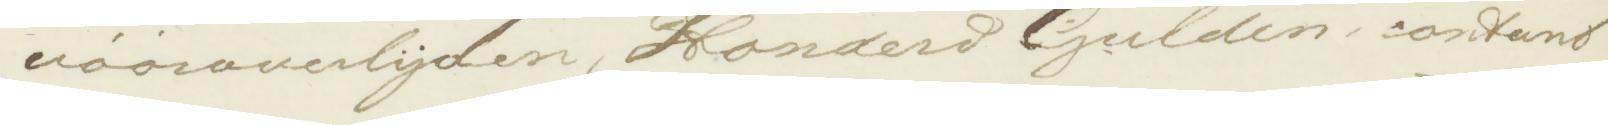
vooroverlijden, Honderd Gulden, contant
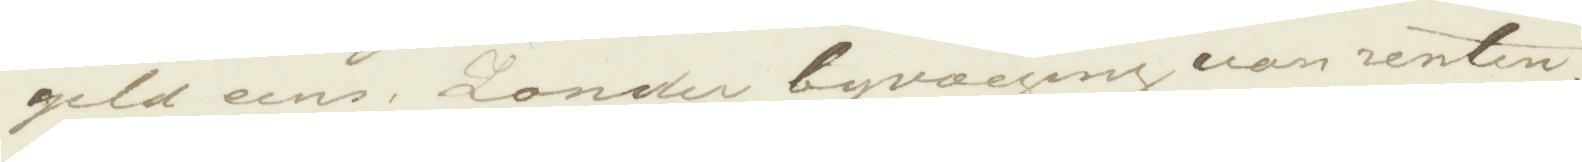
geld eens, zonder byvoeging van renten
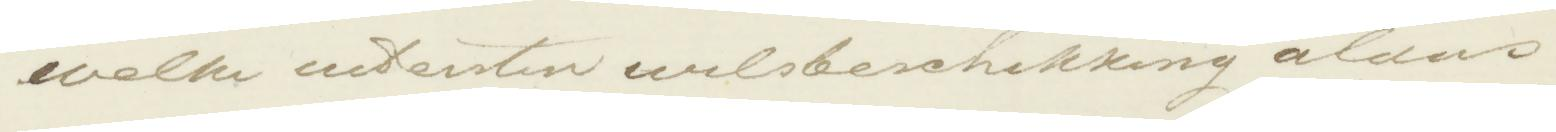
welke uitersten wilsbeschikking aldus
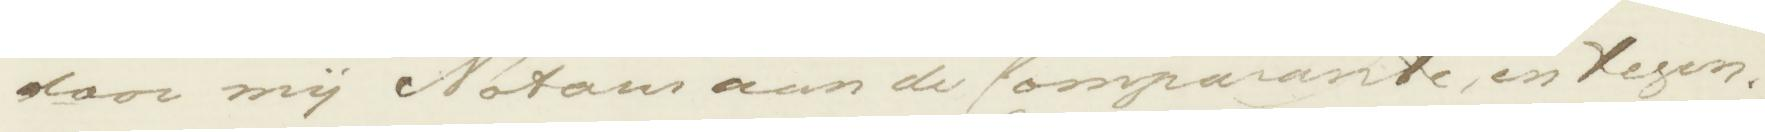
door mij Notaris aan de Comparante, in tegen,
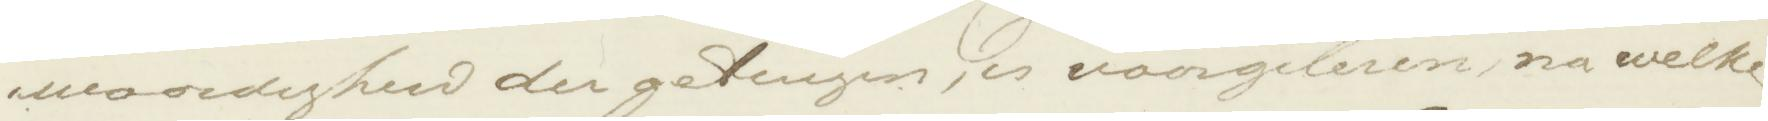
woordigheid der getuigen, is voorgelezen, na welke
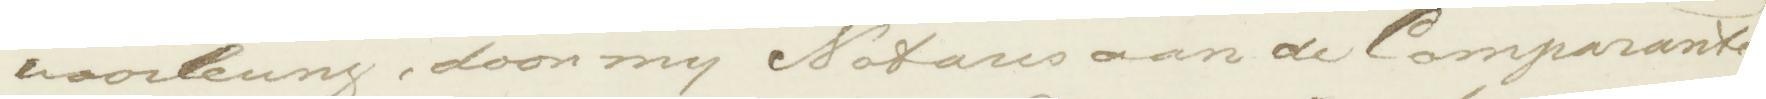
voorlezing, door my Notaris aan de Comparante
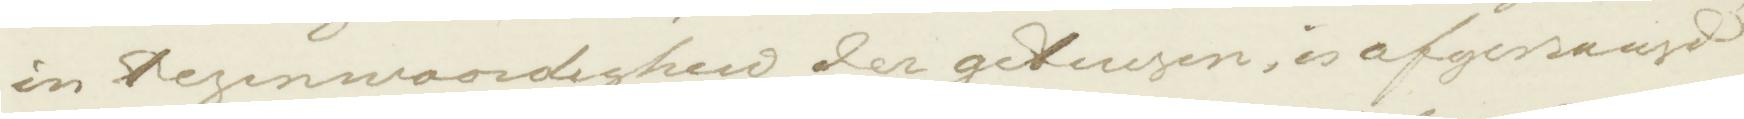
in tegenwoordigheid der getuigen, is afgevraagd
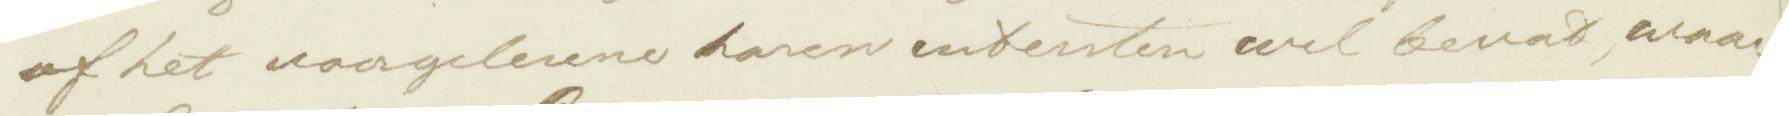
of het voorgelezene haren uitersten wil bevat, waar
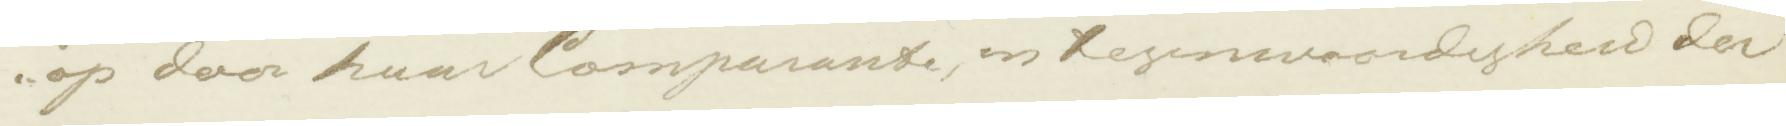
op door haar Comparante, in tegenwoordigheid der
